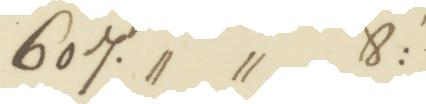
607. „ „ 8:
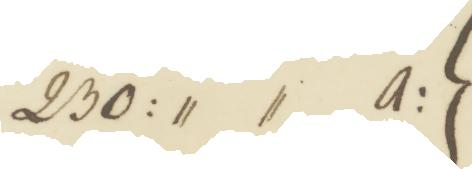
230: „ „ 4: }
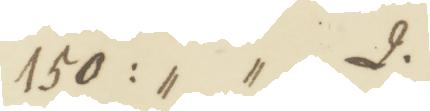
150: „ „ 2.
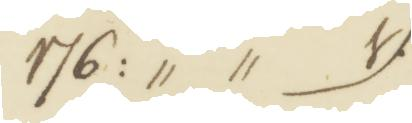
176: „ „ 1}.
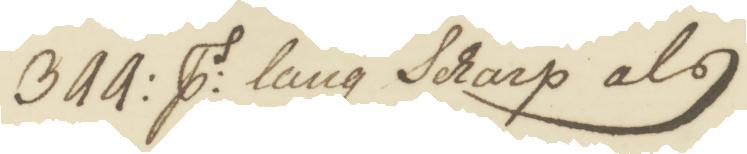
344: p:s lang scharp als
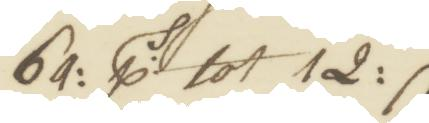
64: p:s tot 12:
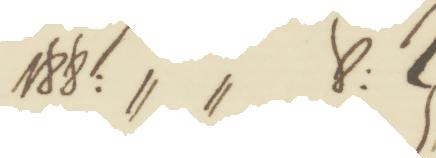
188: „ „ 8: }
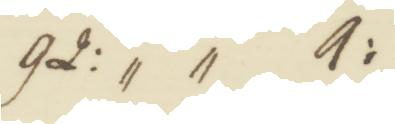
92: „ „ 4:
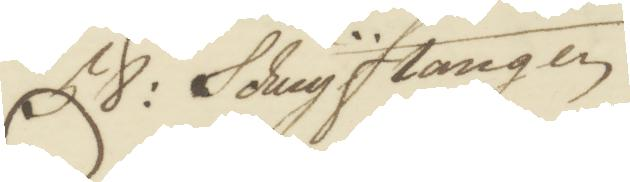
58: Schuijftangen
